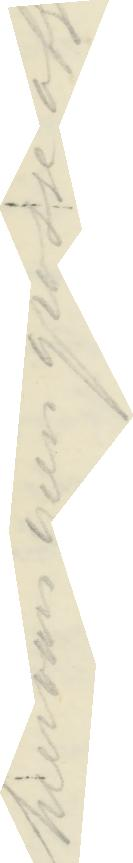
hiervan geen grosse afge
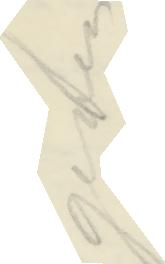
geven
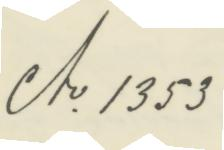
N.o 1353
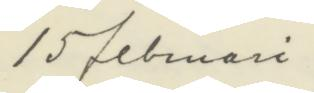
15 februari
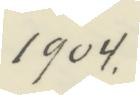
1904.
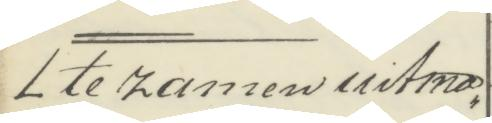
¶ te zamen uitma„
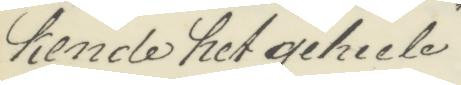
kende het geheele
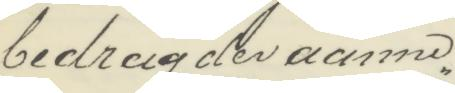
bedrag der aanne
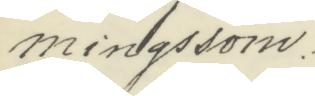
mingssom.
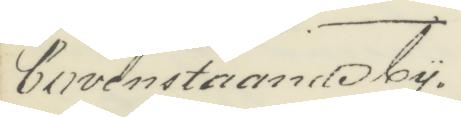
bovenstaande bij„
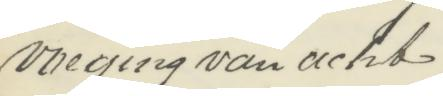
voeging van acht
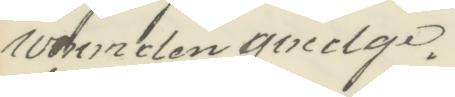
woorden goedge„
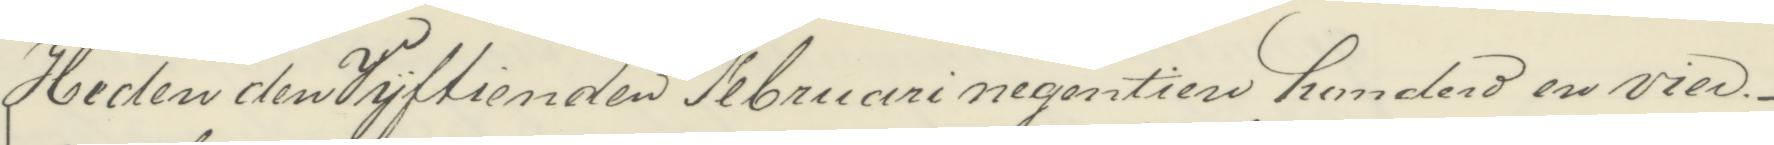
Heden den Vijftienden Februari negentien honderd en vier.
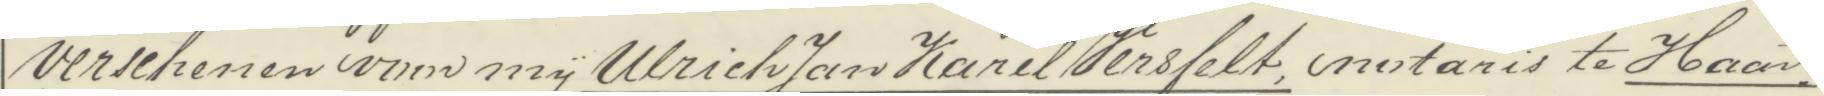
verschenen van mij Ulrich Jan Karel Versfelt, notaris te Haar-
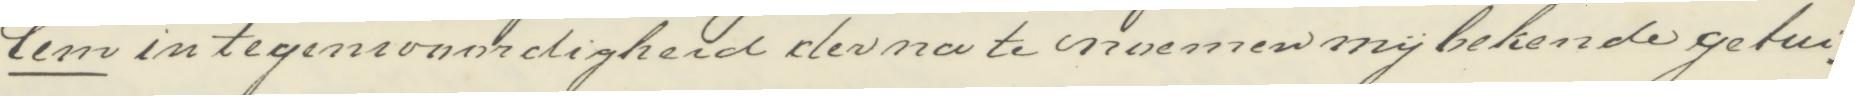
lem in tegenwoordigheid der na te noemen mij bekende getui„
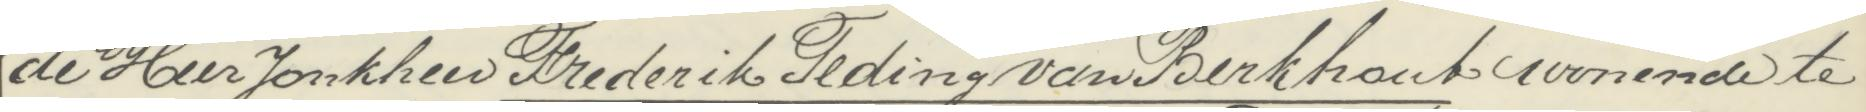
de Heer Jonkheer Frederik Teding van Berkhout wonende te
